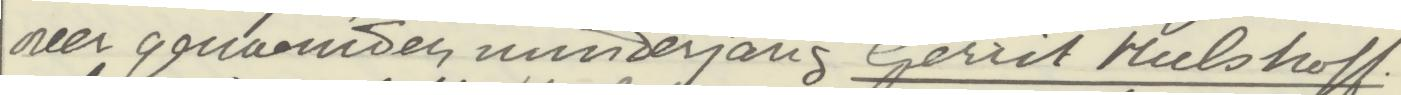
over genoemden minderjarig Gerrit Hulshoff.
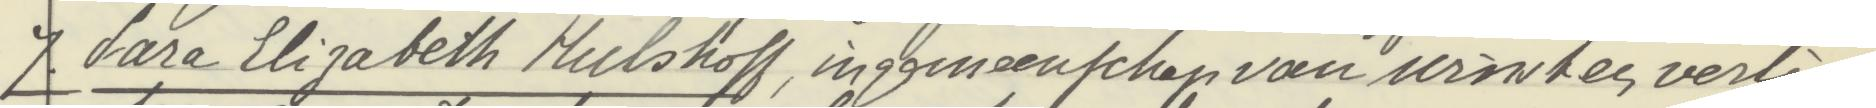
7. Sara Elisabeth Hulshoff, in gemeenschap van winst en verlies
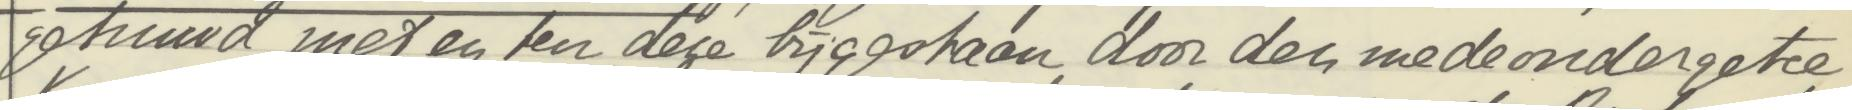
gehuwd met en ten deze bijgestaan door den mede ondergetee
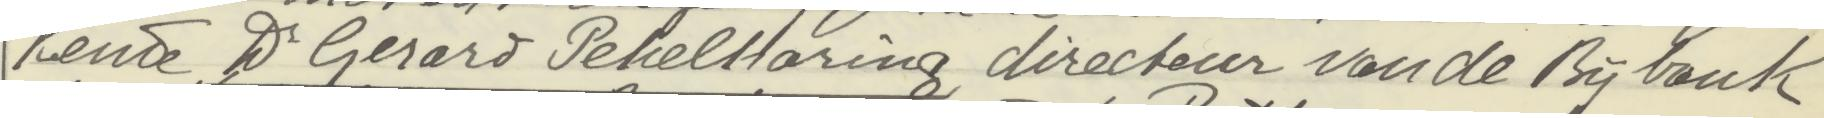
kende Dr Gerard Pekelharing, directeur van de Bijbank
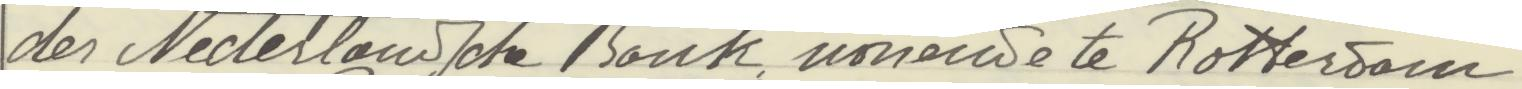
der Nederlandsche Bank, wonende te Rotterdam
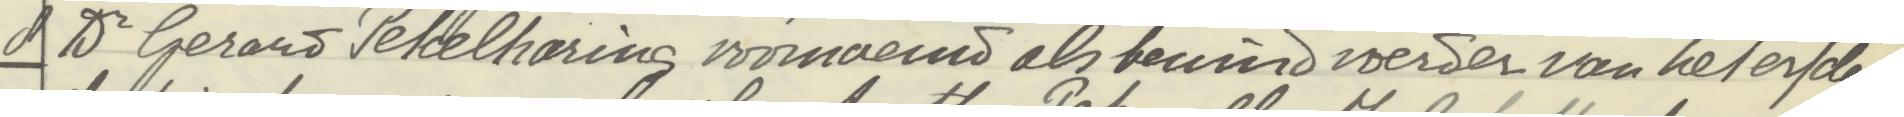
8 Dr Gerard Pekelharing voornoemd als bewindvoerder van het erfdeel
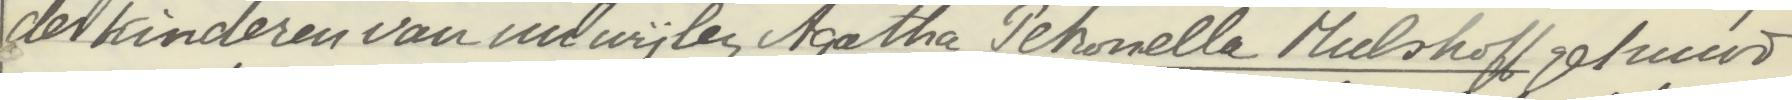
der kinderen van nu wijlen Agatha Petronella Hulshoff, gehuwd
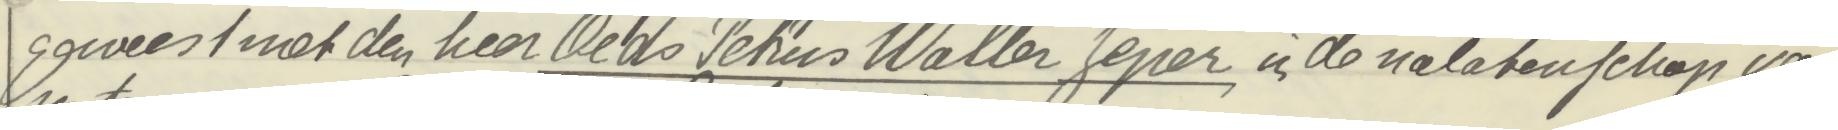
geweest met den heer Oeds Petrus Waller Zeper, in de nalatenschap van
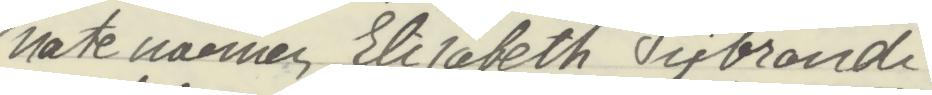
na te noemen Elizabeth Sijbrandi
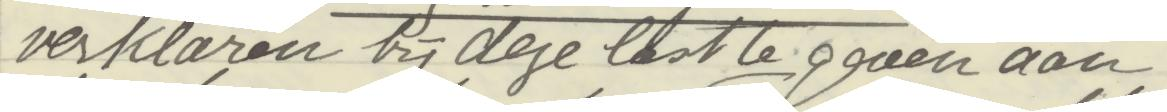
verklaren bij deze last te geven aan
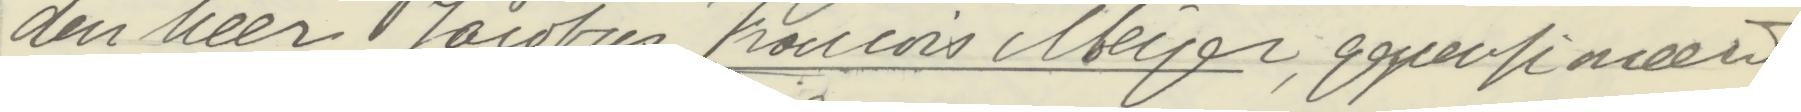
den heer Jacobus Francois Meijer, gepensioneerd
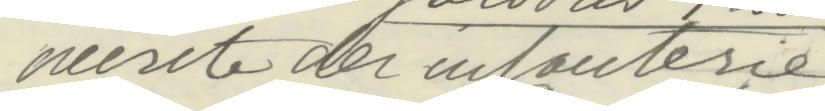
overste der infanterie
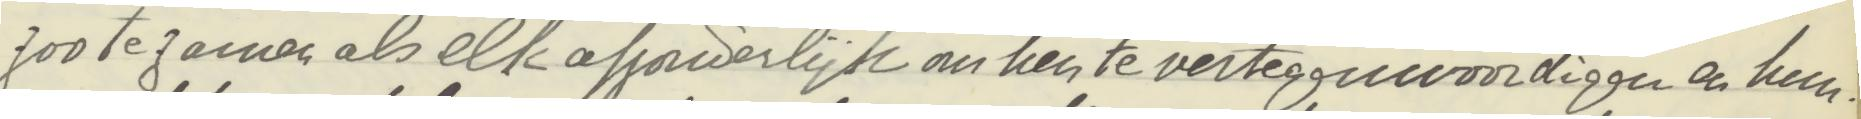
zoo te zamen als elk afzonderlijk om hen te vertegenwoordigen en hun
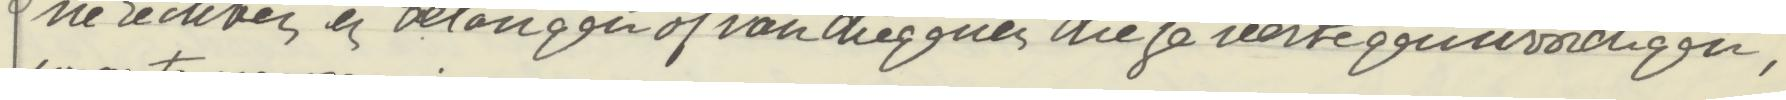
ne rechten en belangen of van diegenen die ze vertegenwoordigen,
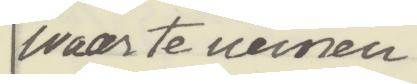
waar te nemen
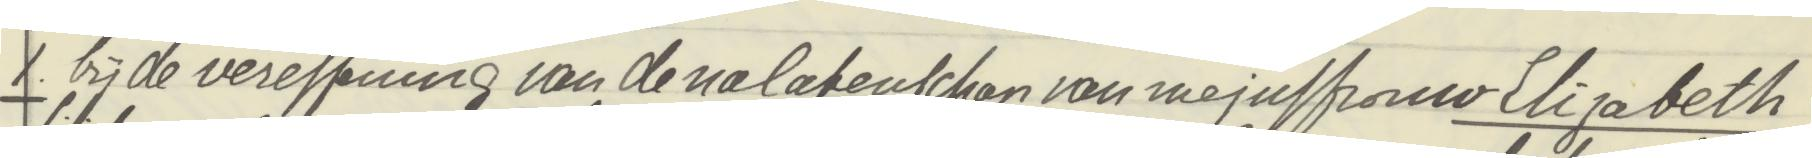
1. bij de vereffening van de nalatenschap van mejuffrouw Elizabeth
